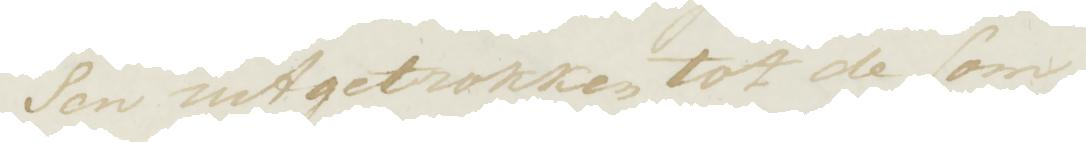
sen uitgetrokken tot de som
